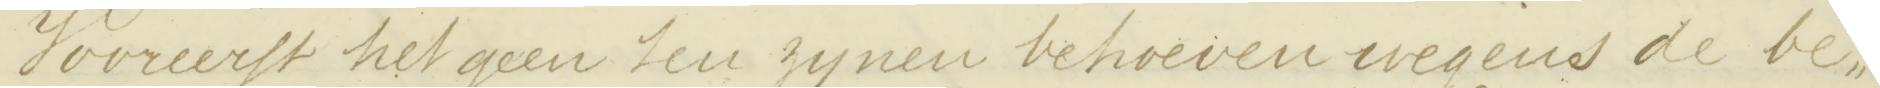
Vooreerst het geen ten zynen behoeven wegens de be„
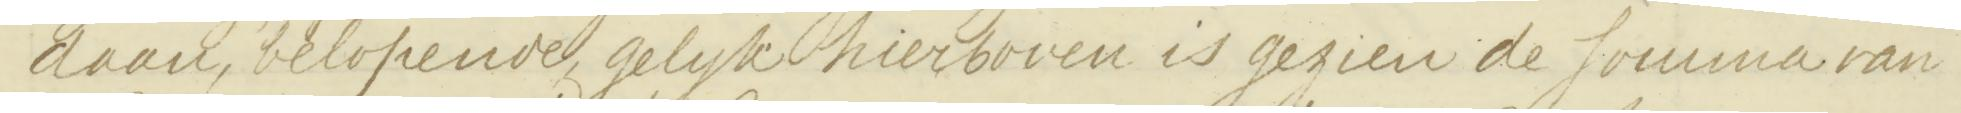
daan, belopende, gelyk hierboven is gezien de somma van
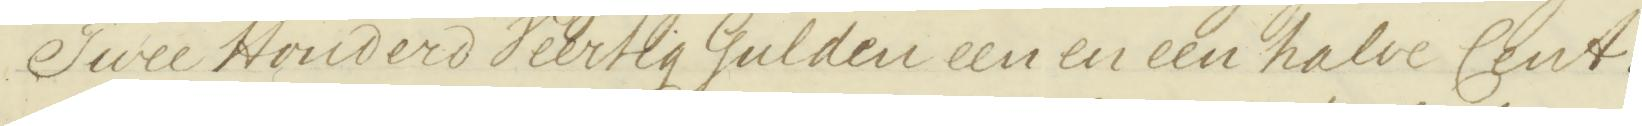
Twee Honderd Veertig Gulden een en een halve Cent.
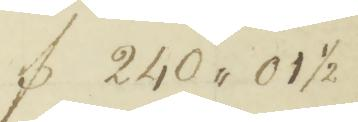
ƒ 240 „ 01½
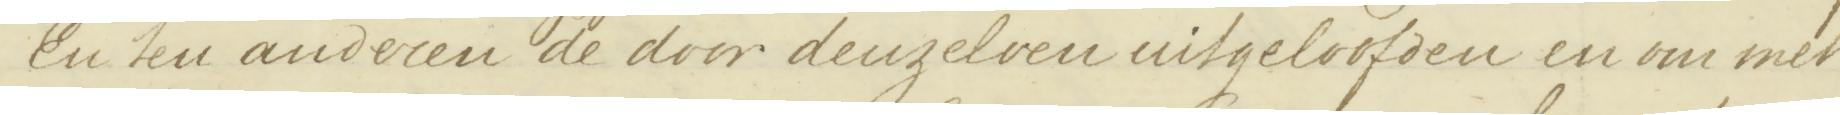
En ten anderen de door denzelven uitgeloofden en om met
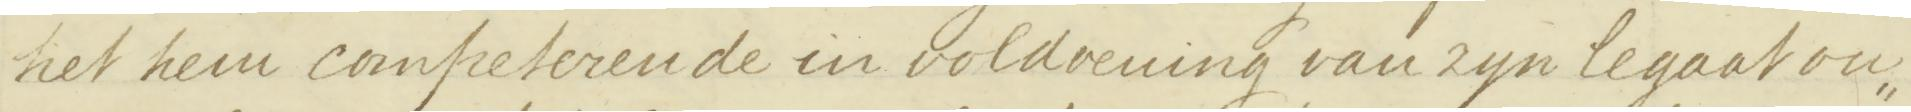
het hem competerende in voldoening van zijn legaat on„
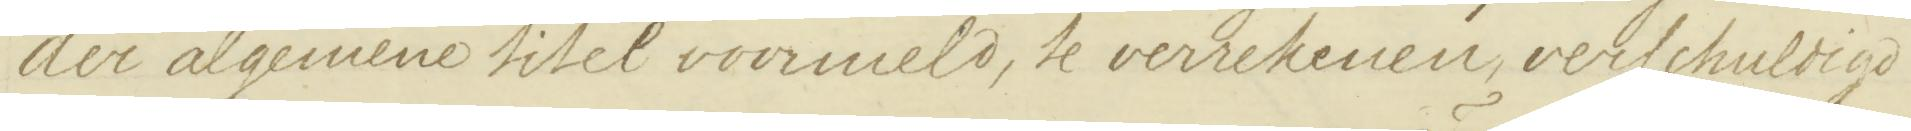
der algemene titel voormeld, te verrekenen, verschuldigd
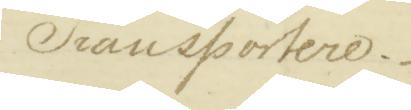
Transportere.
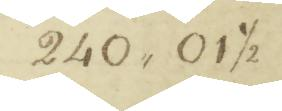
240„ 01½
